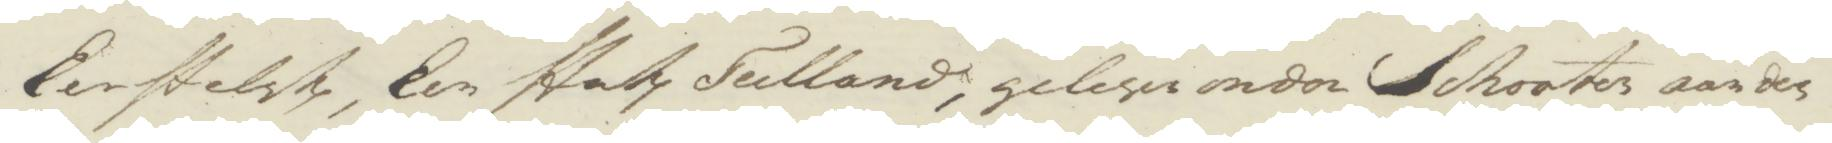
Eerstelyk, Een stuk Teelland, gelegen onder Schooten aan den
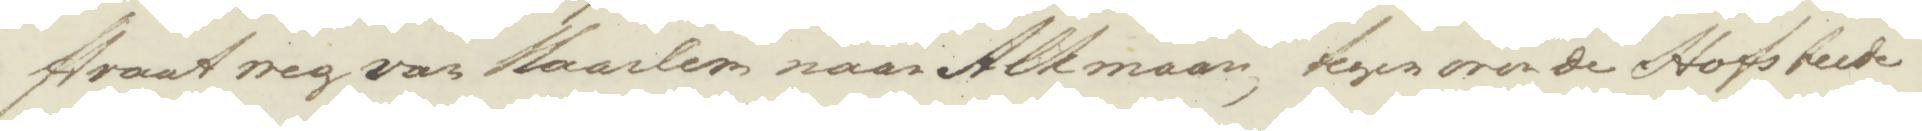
straatweg van Haarlem naar Alkmaar, tegen over de Hofsteede
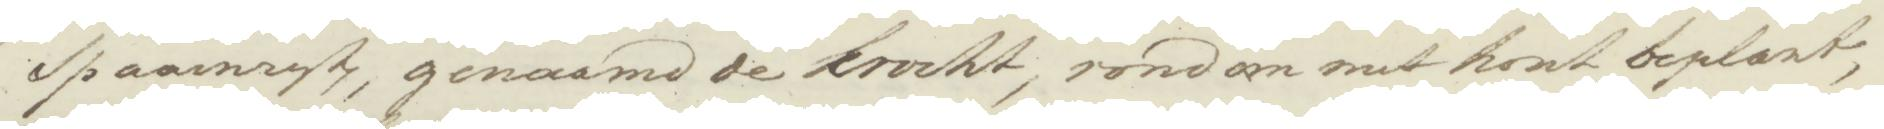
Spaarnryk, genaamd de krocht; rondom met hout beplant,
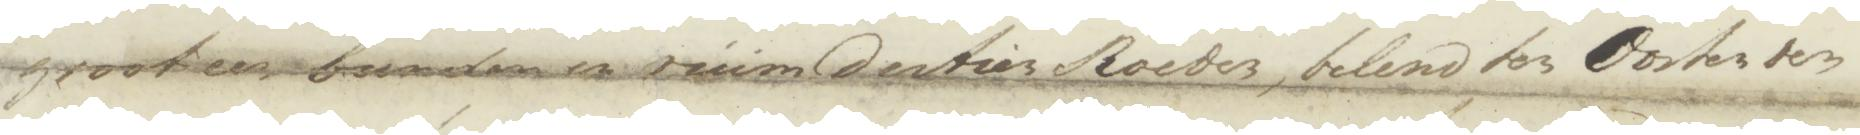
groot een bunder en ruim dertien Roeden, belend ten Oosten den
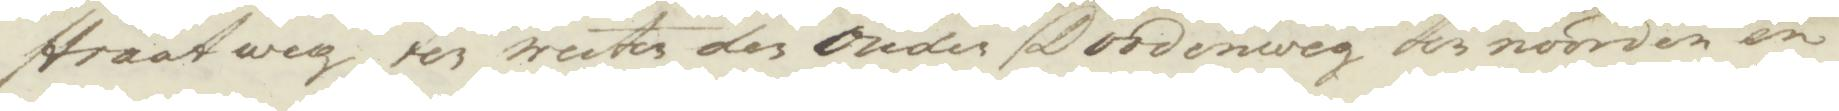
Straatweg ten westen den Ouden Doodenweg ten noorden en
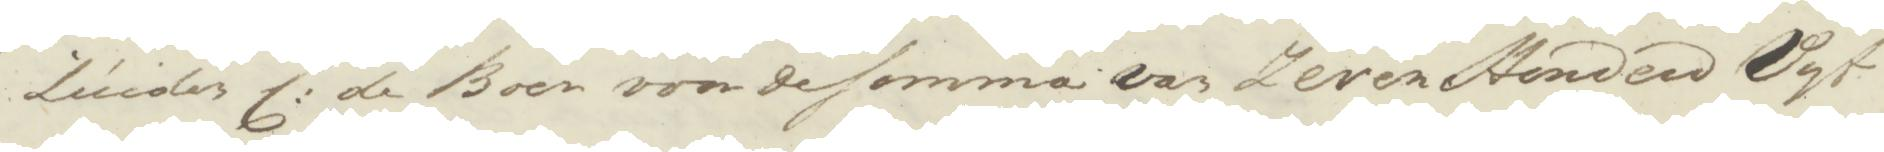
Zuiden C: de Boer voor de Somma van Zeven Honderd Vyf
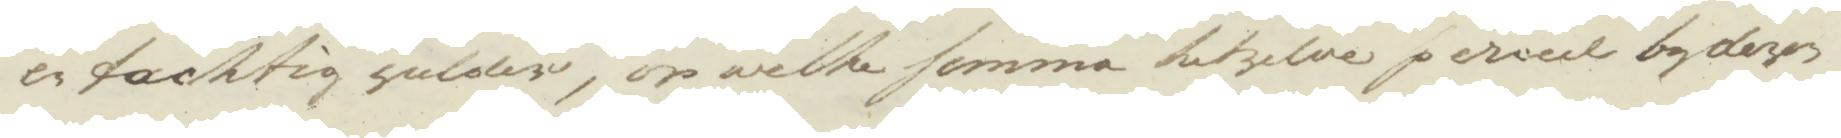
en tachtig gulden, op welke Somma hetzelve perceel by dezen
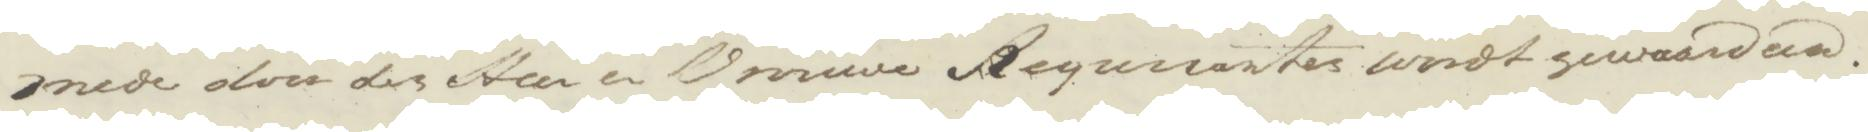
mede door den Heer en Vrouwe Requiranten wordt gewaardeerd.
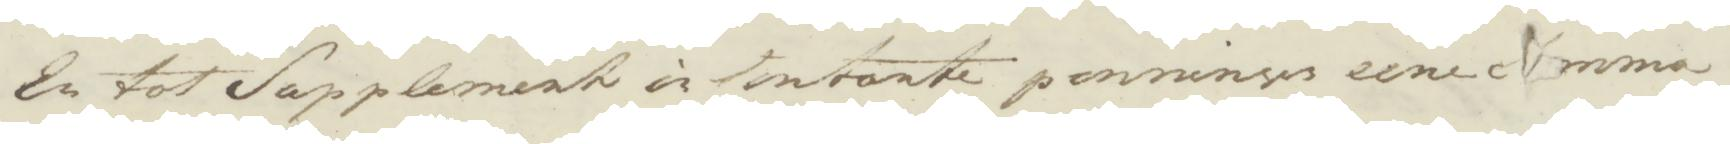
En tot Supplement in Contante penningen eene Somma
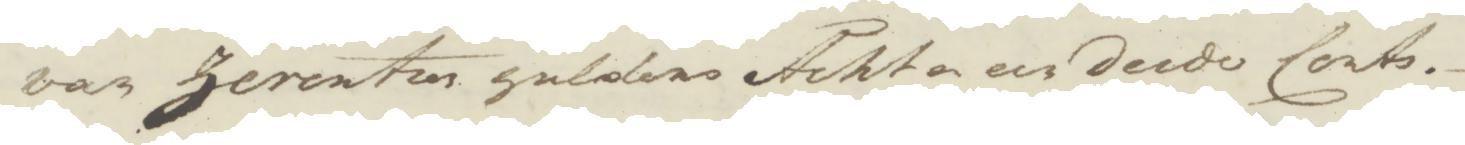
van Zeventien guldens Acht en een derde Cents.
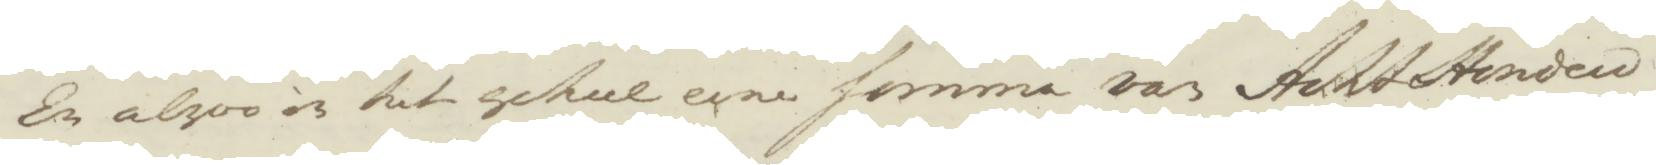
En alzoo in het geheel eene somma van Acht Honderd
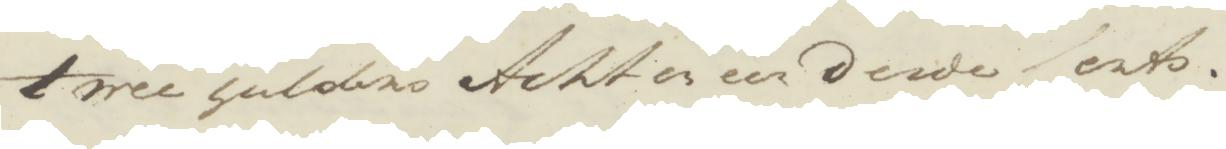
twee guldens Acht en een derde Cents.
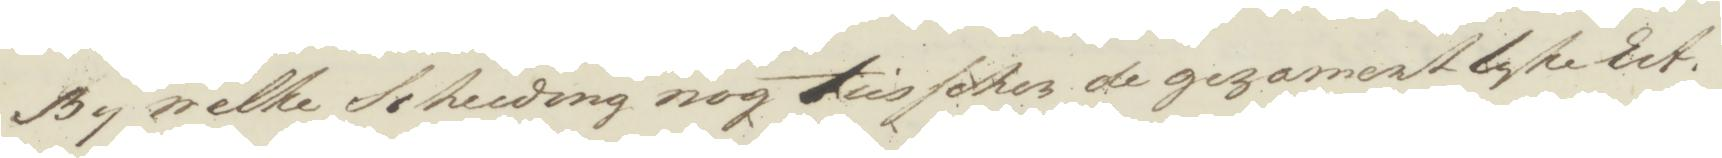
By welke scheiding nog tusschen de gezamentlyke Erf
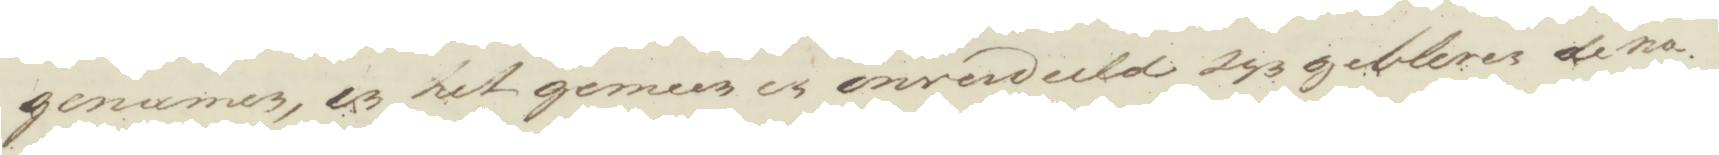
genamen, en het gemeen en onverdeeld zyn gebleven de na„
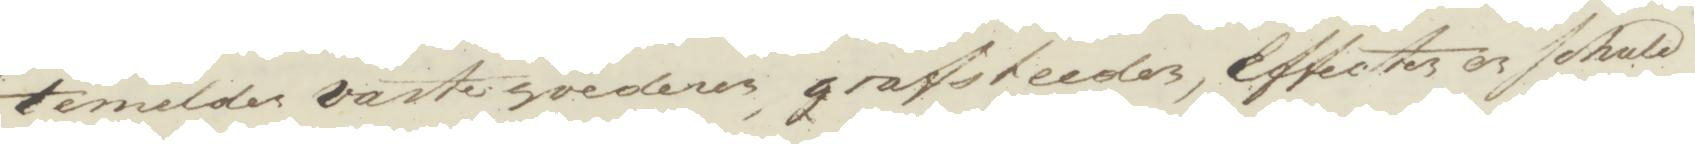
te melden vaste goederen, grafsteeden, Effecten en Schuld
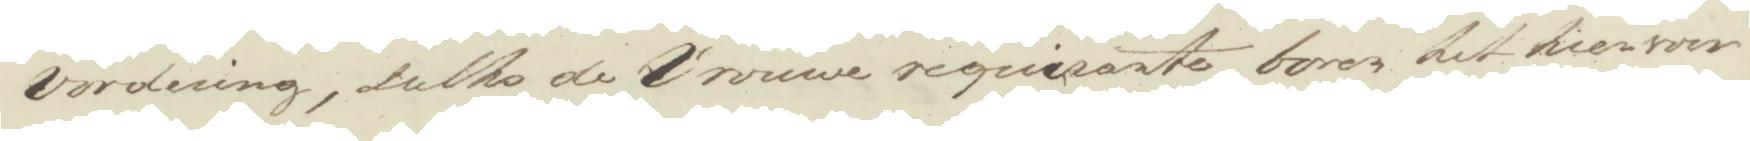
vordering, zulks de Vrouwe requirante boven het hiervoor
